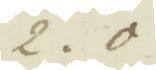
2. d
